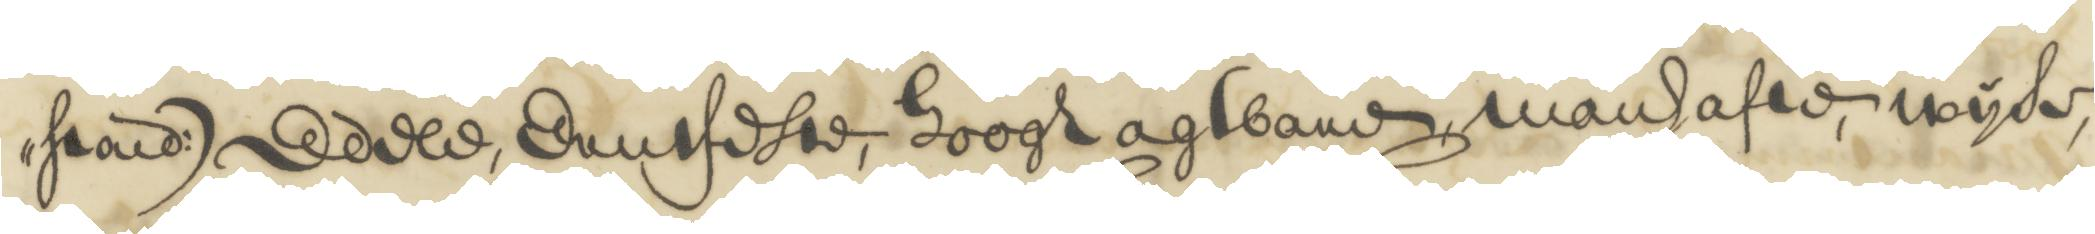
„stond:) Edele, Erntfeste, hoogh agtbare, manhafte, wijse,
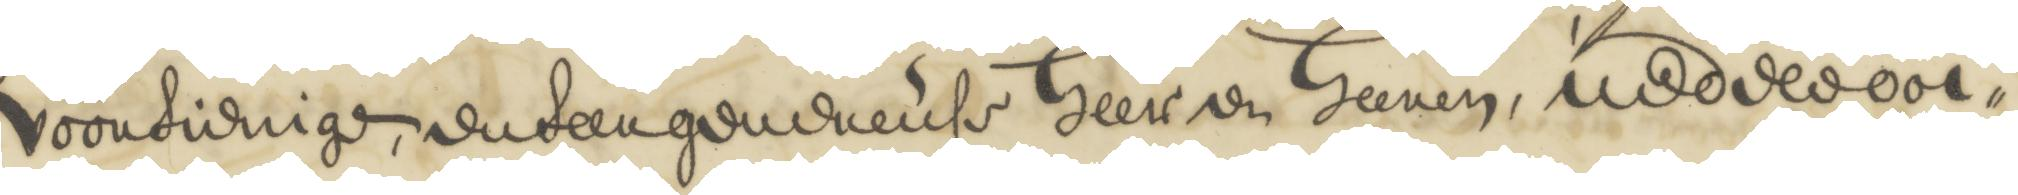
voorsienige, en seer genereuse heer en heeren, uEdele oot„
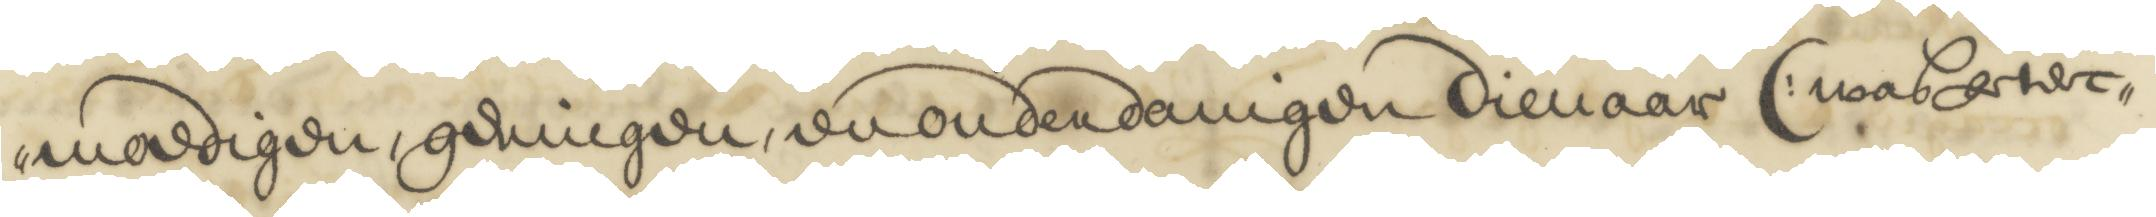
„moedigen, geringen, en onderdanigen dienaar (:was geteec„
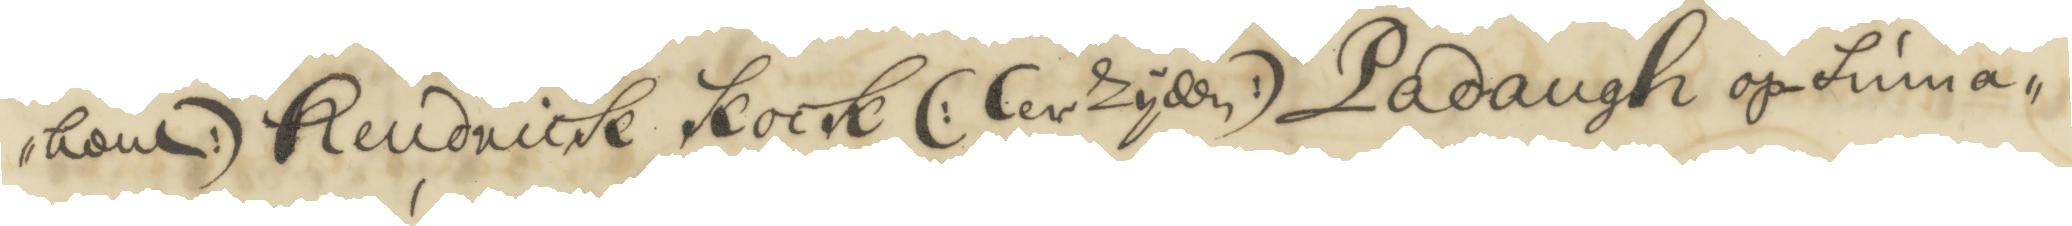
„kent:) Hendrick kock (:ter zijden:) Padangh op suma„
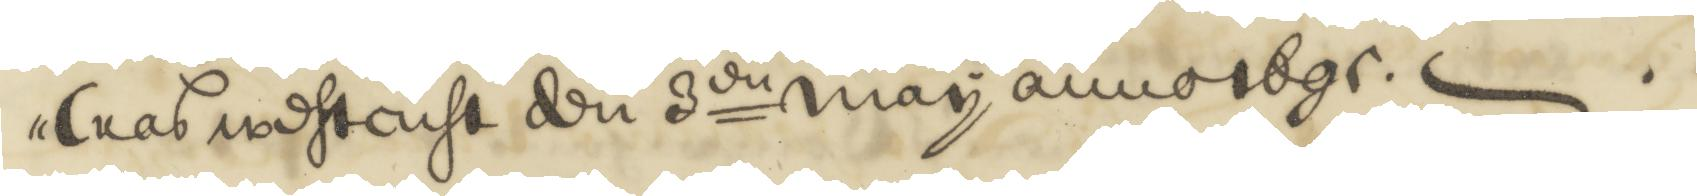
„tras west cust den 3=en maij anno 1695. —.
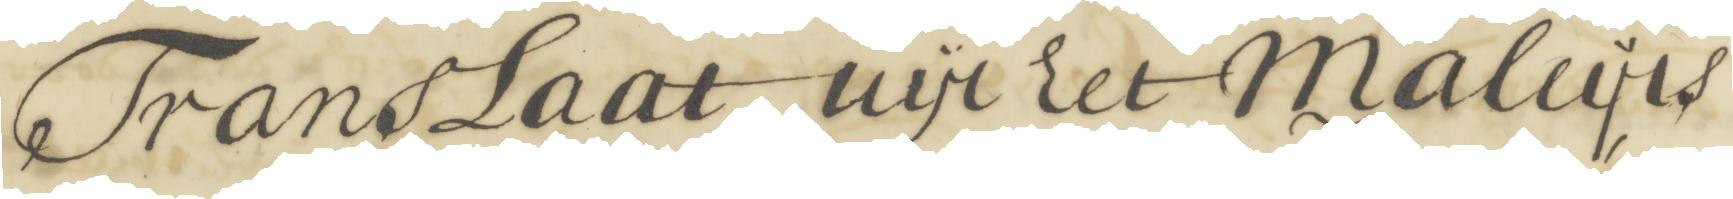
Translaat uijt het Maleijts
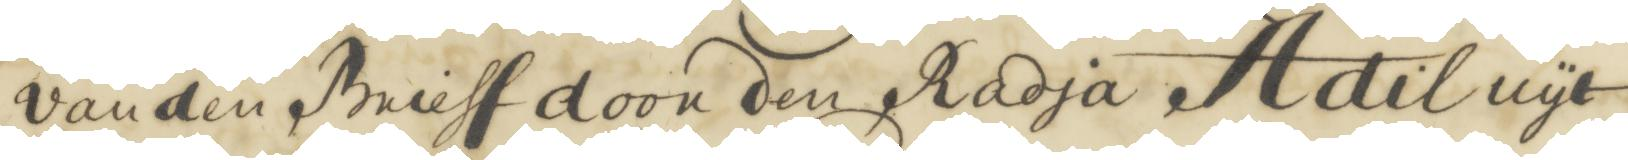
van den Brieff door den Radja Adil uijt
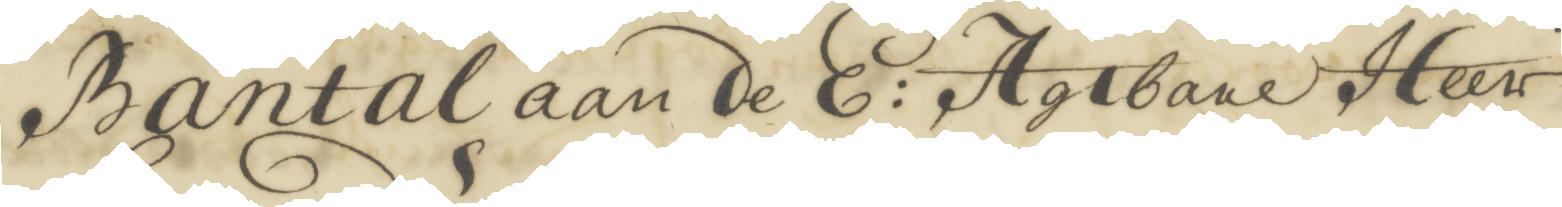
Bantal aan de E: Agtbare Heer
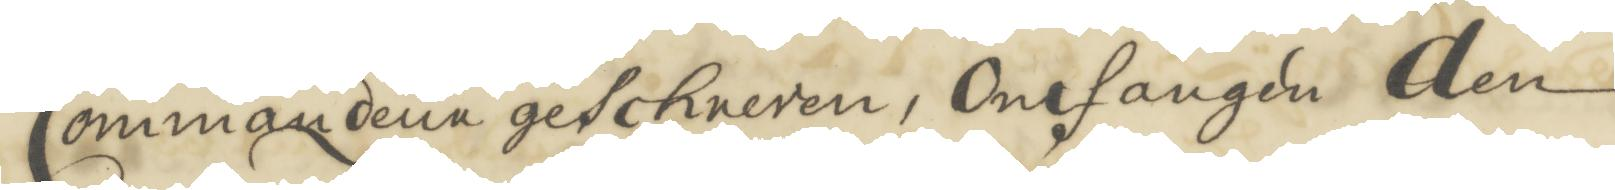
Commandeur geschreven, Ontfangen Den
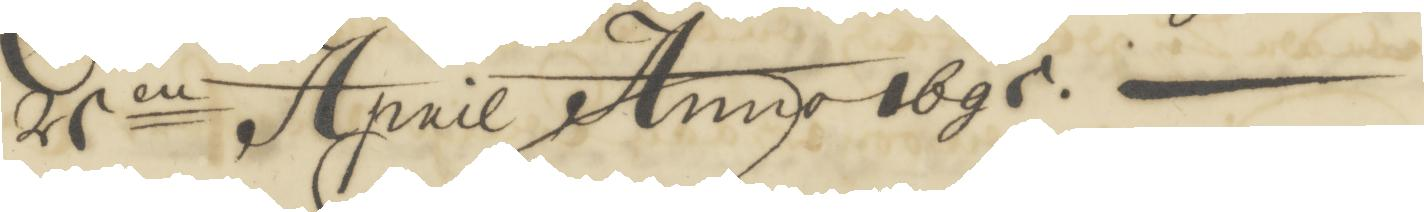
25=en April Anno 1695. —
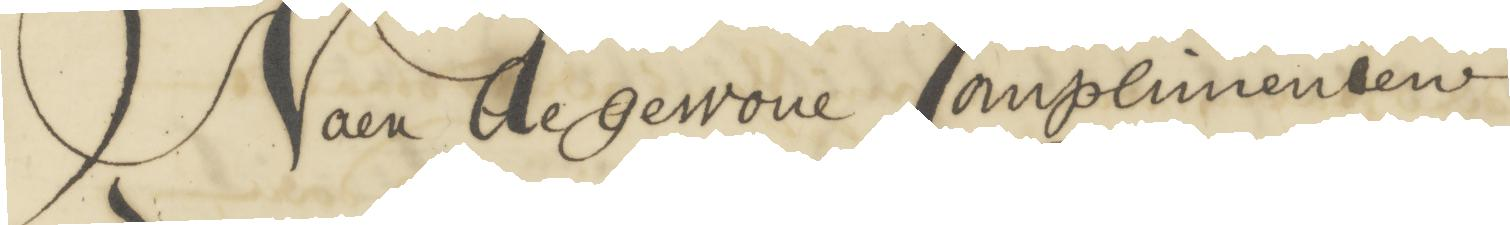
Naer de gewone Complimenten
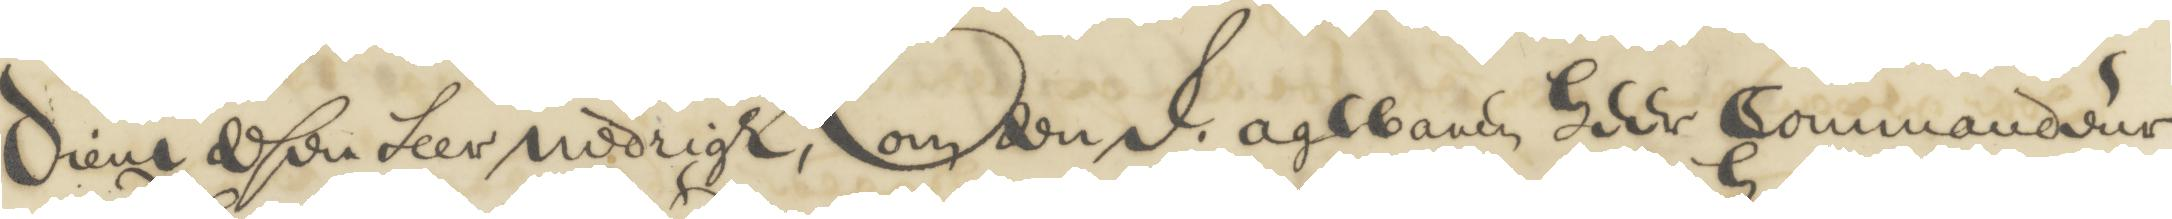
dient desen seer nedrigh, om den E: agtbaren heer Commandeur
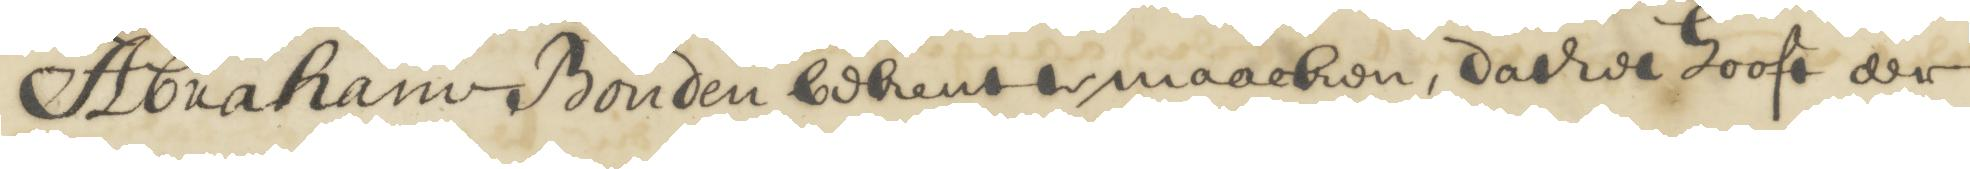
Abraham Bouden bekent te maacken, dat het hooft der
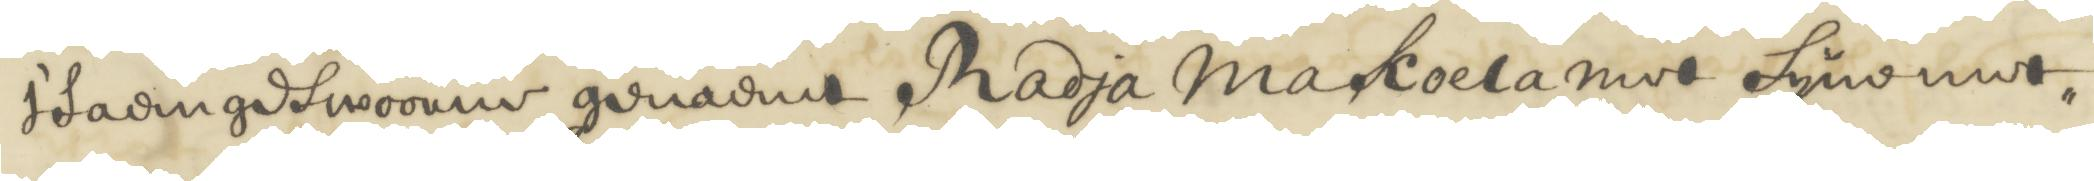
t'saem geswoorne genaemt Radja Makoeta met sijne met„
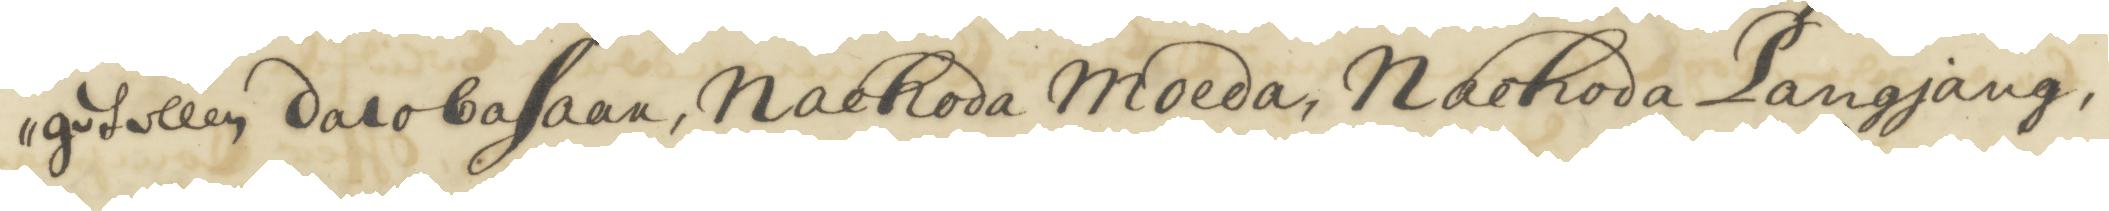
„gesellen dato basaar, Nachoda Moeda, Nachoda Pangjang,
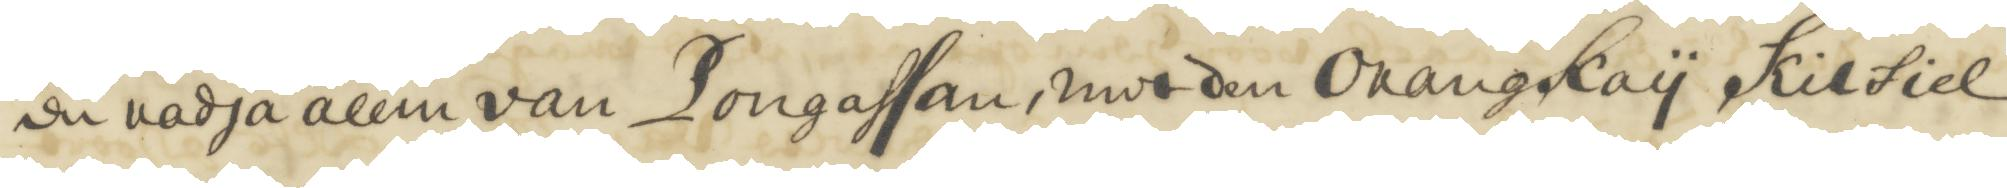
en radja alem van Pongassan, met den Orangkaij kitsiel
